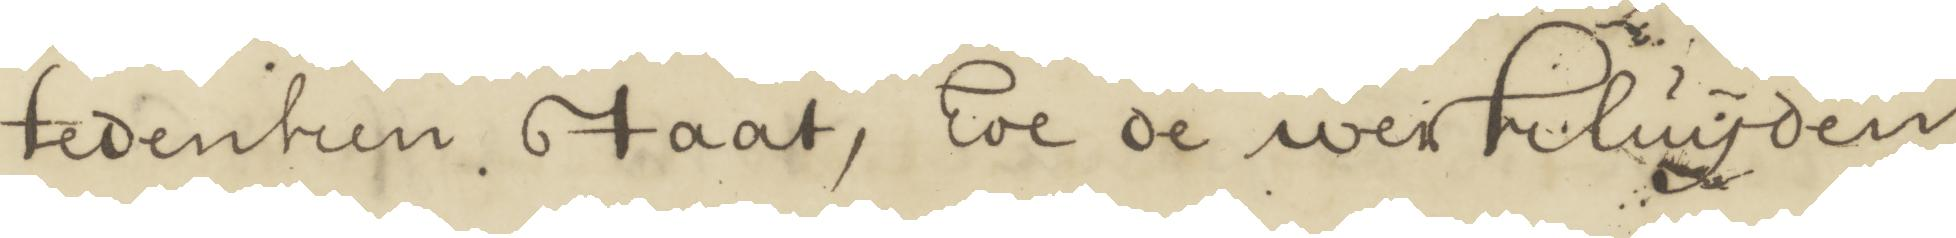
tedenken staat, hoe de werkluijden
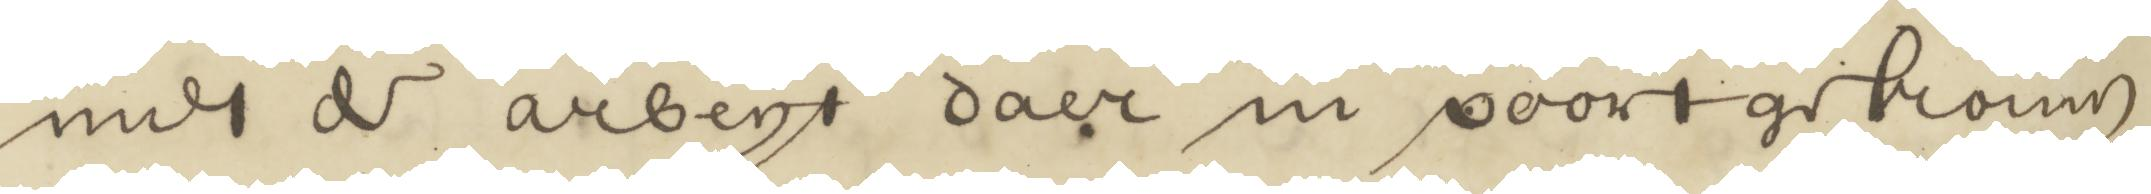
met de arbeijt daer in voort gekomen
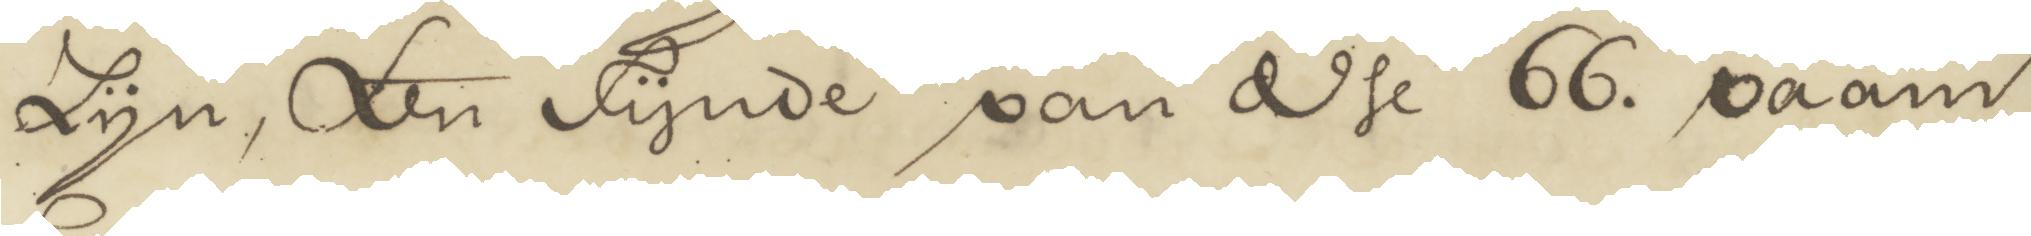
zijn, ten Eijnde van dese 66. vaam
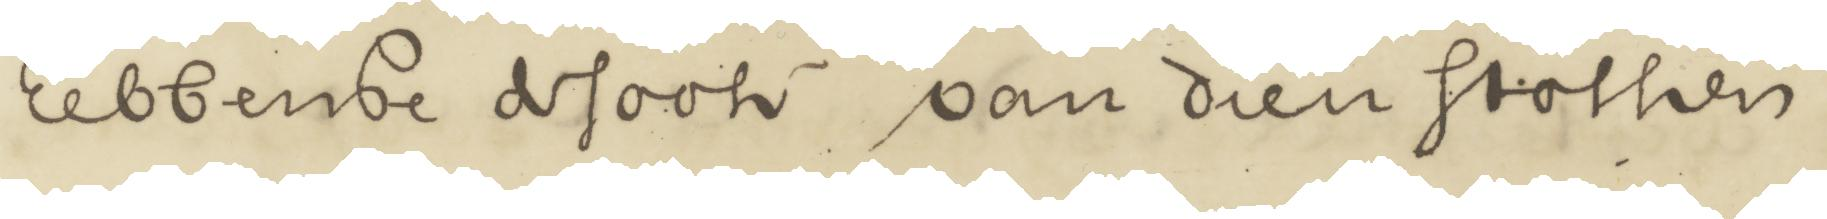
hebbense desook van dien stollen
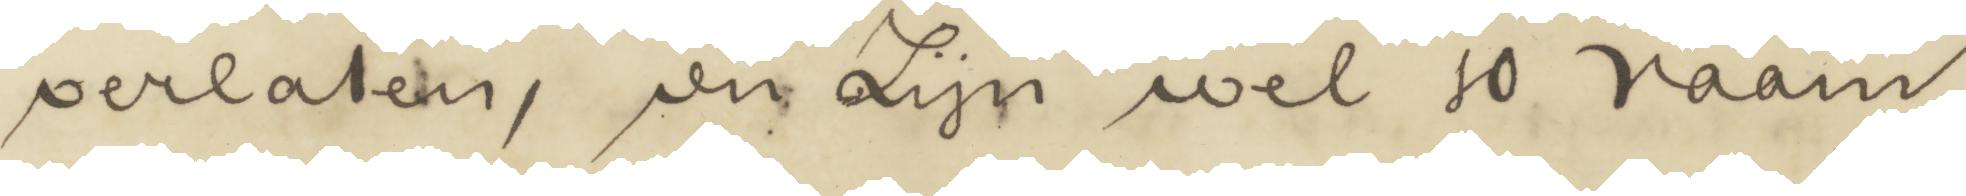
verlaten, en Zijn wel 10 vaam
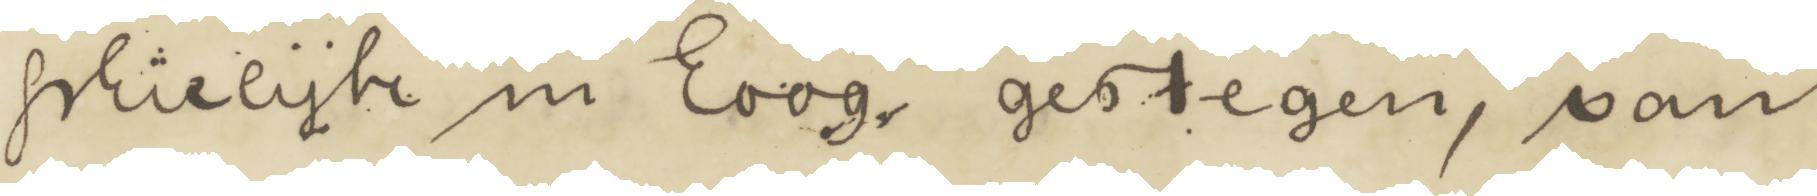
schielijk in hoog, gestegen, van
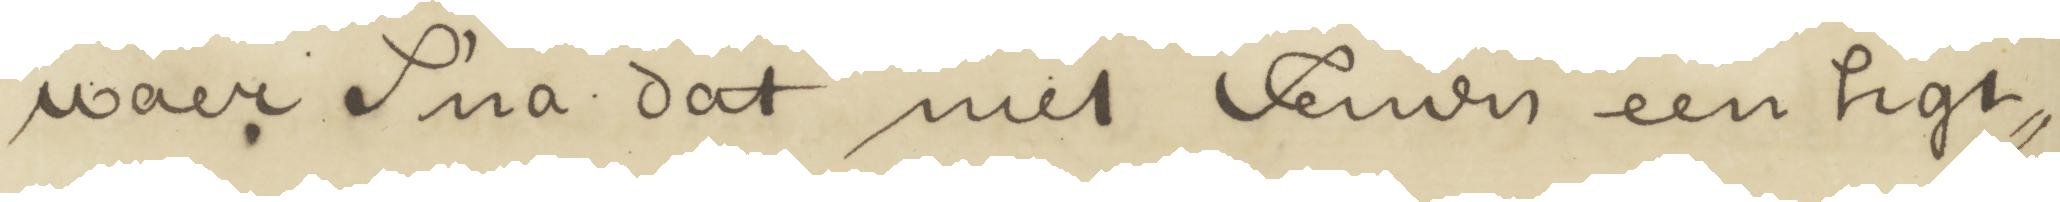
waer S'na dat met Eenen een ligt„
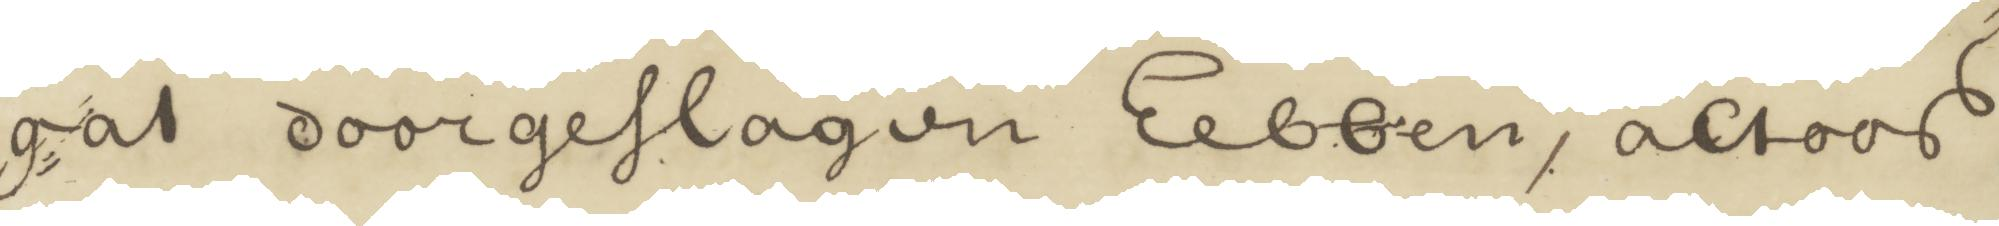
gat doorgeslagen hebben, altoos
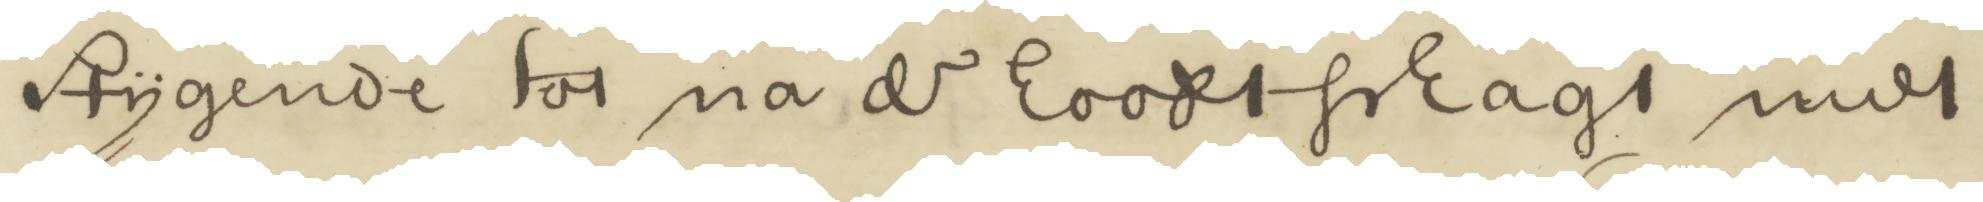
stijgende tot na de hooftschagt met
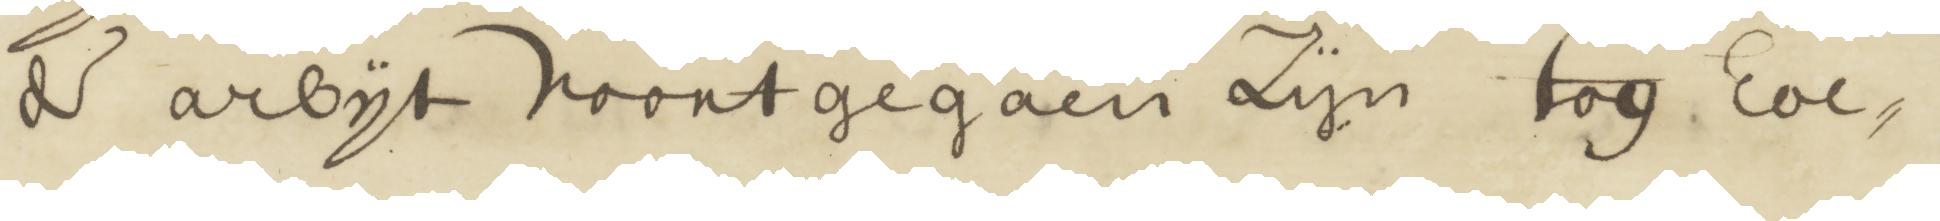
de arbijt voort gegaen Zijn tog hoe„
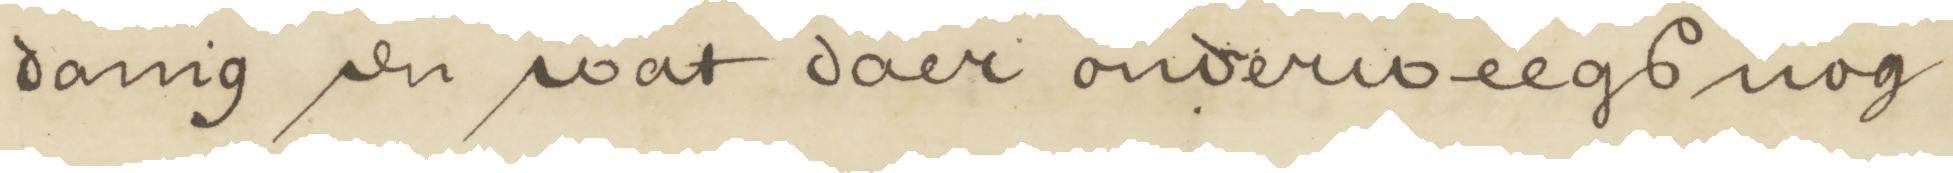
danig en wat daer onderweegs nog
